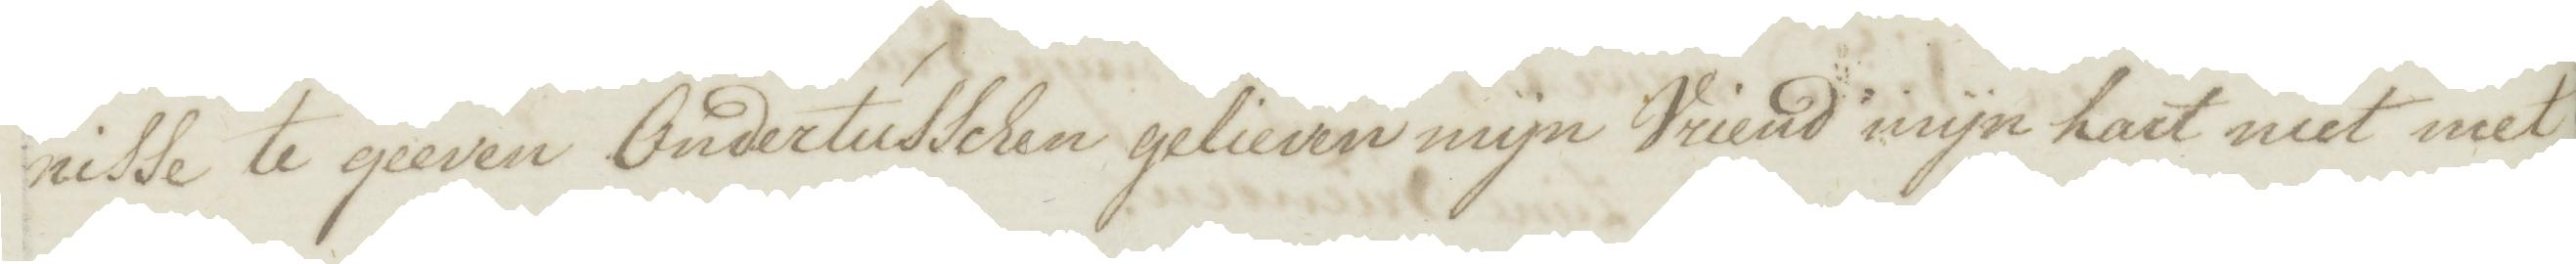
nisse te geeven Ondertusschen gelieven mijn Vriend mijn hart niet met
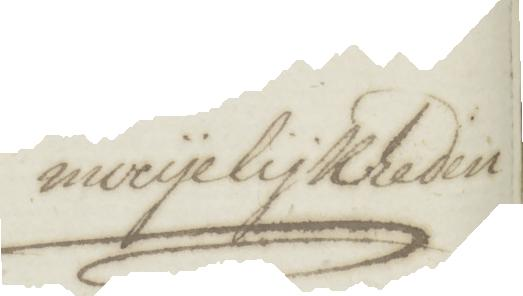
moeijelijkheden
